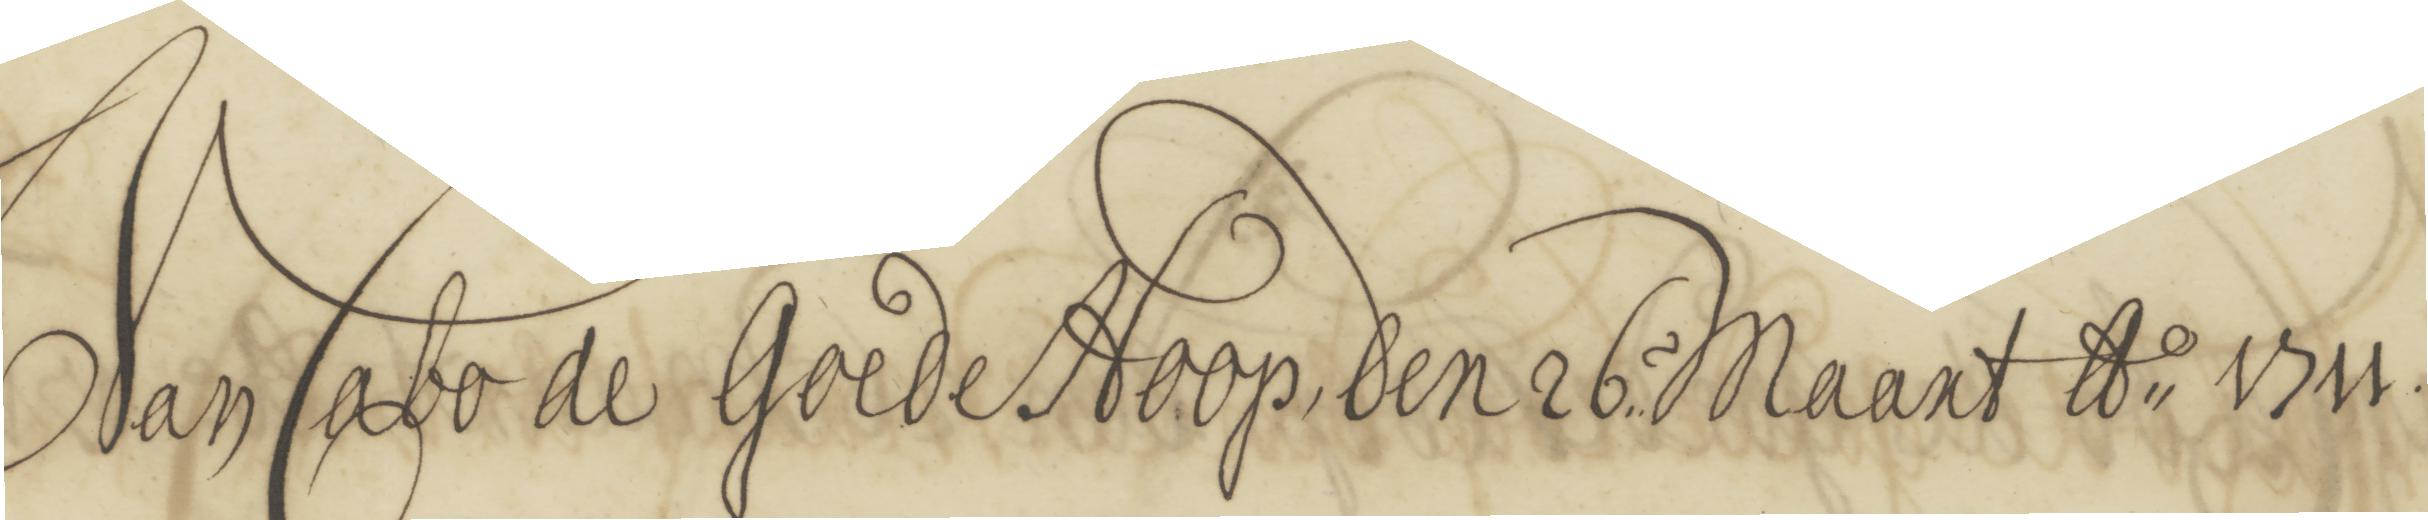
Van Cabo de Goede Hoop, den 26.' Maart A„o 1711.
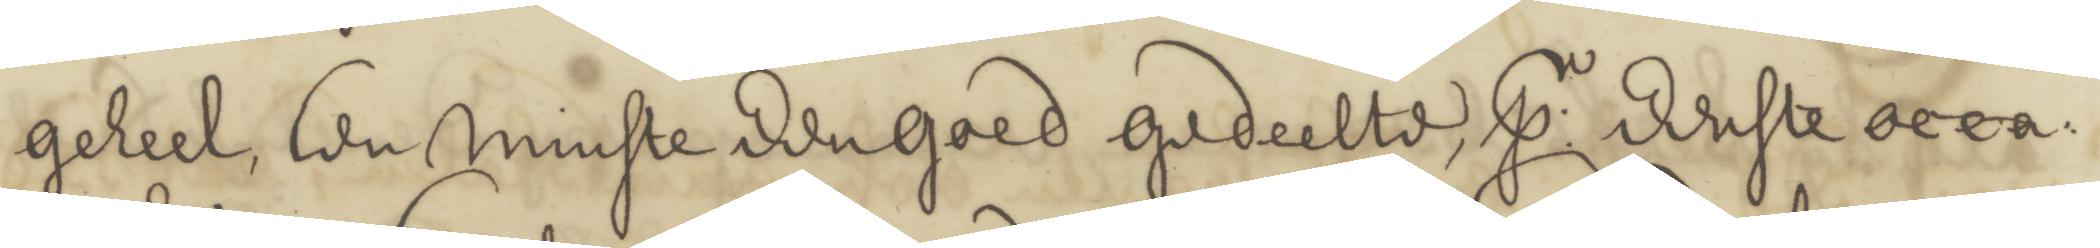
geheel, ten minste Een goed gedeelte, p:r Eerste occa:
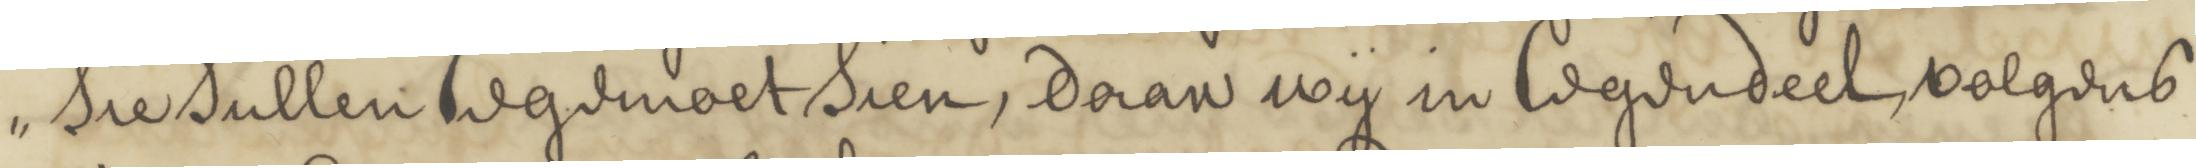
„sie sullen tegemoet sien, daar wij in tegendeel, volgens
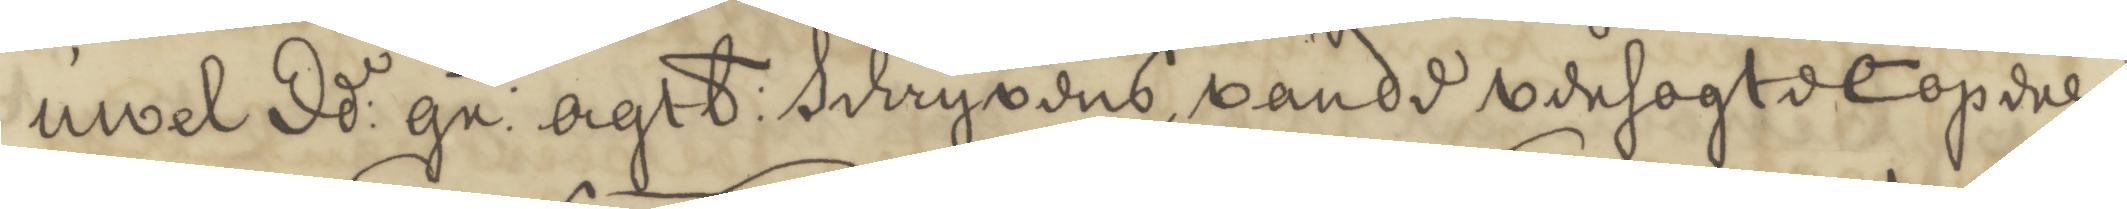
uwel Ed:e gr: agtb: schrijvens, van de versogte Copere
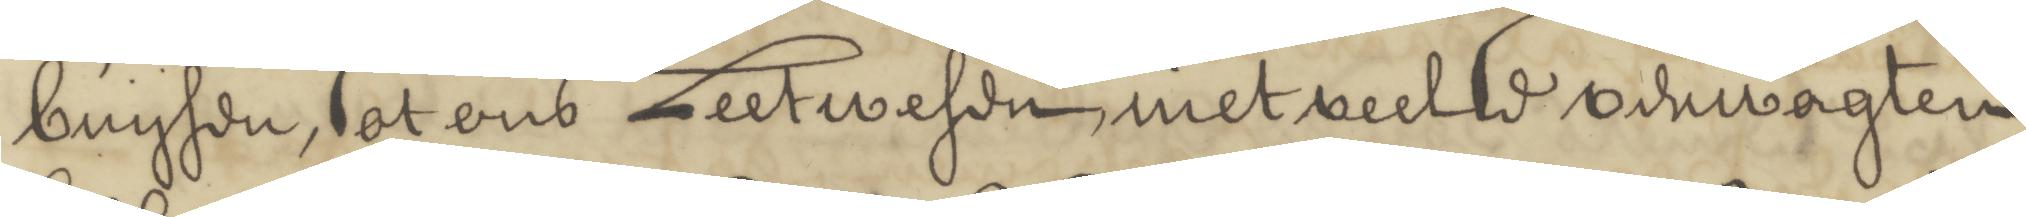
buijsen, tot ons Leetwesen, niet veel te verwagten
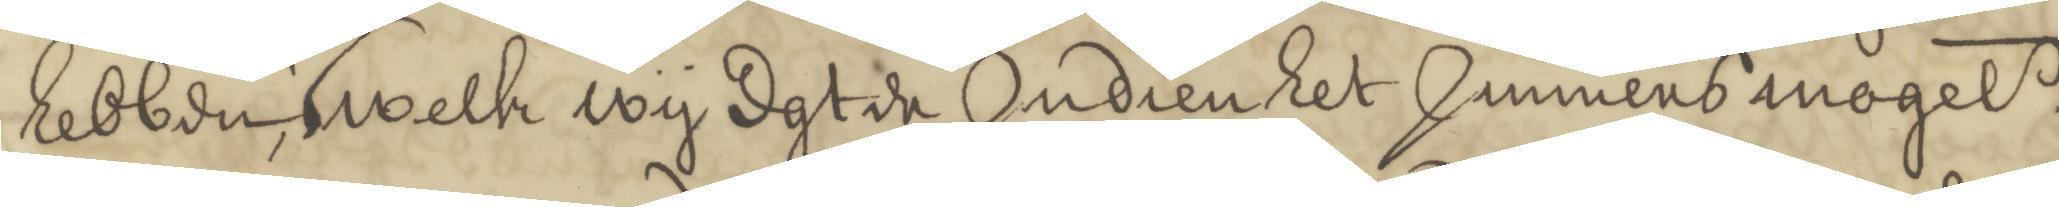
hebben 'twelk wij Egter Jndien het Jmmers mogelijk
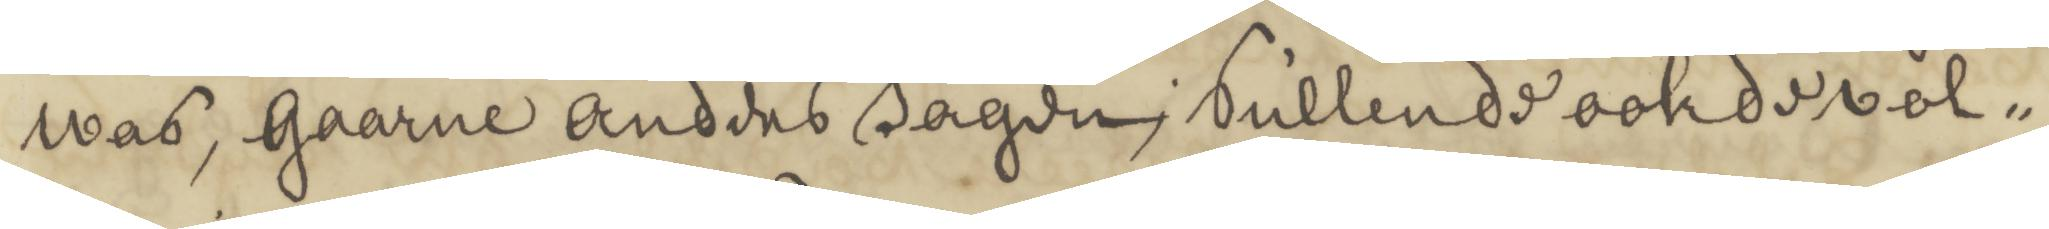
was, gaarne anders sagen; sullende ook de vol„
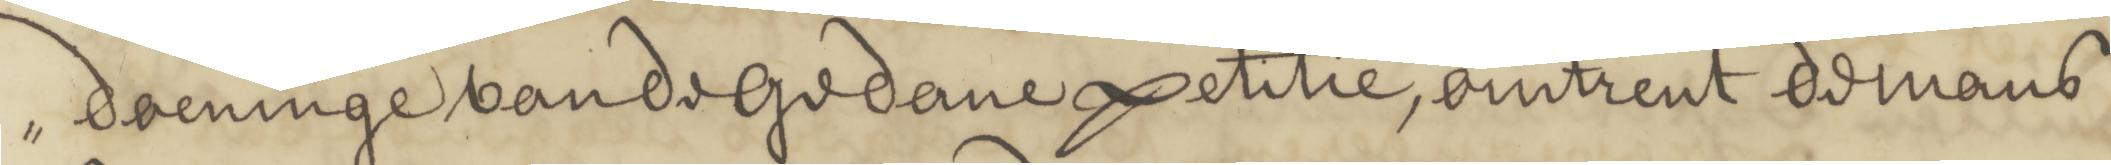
„doeninge van de gedane petitie, omtrent de mans
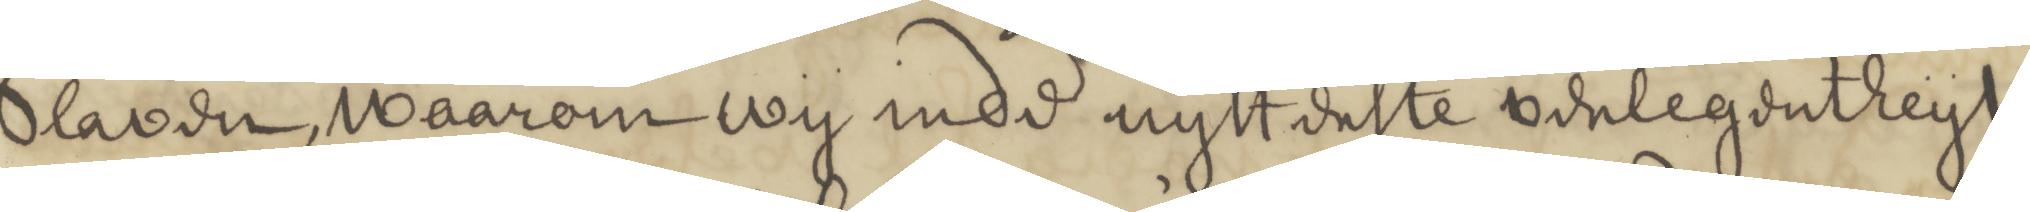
slaven, waarom wij inde uijtterste verlegentheijt
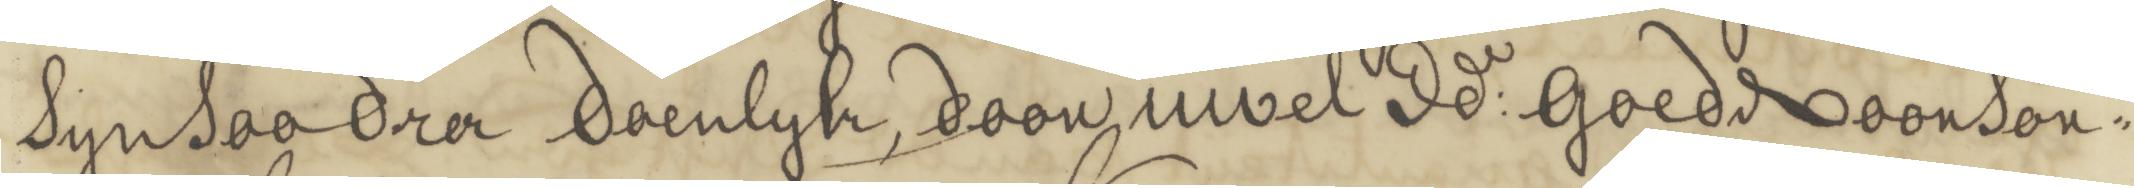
sijn soodra doenlyk, door uwel Ed:e goede voorsor„
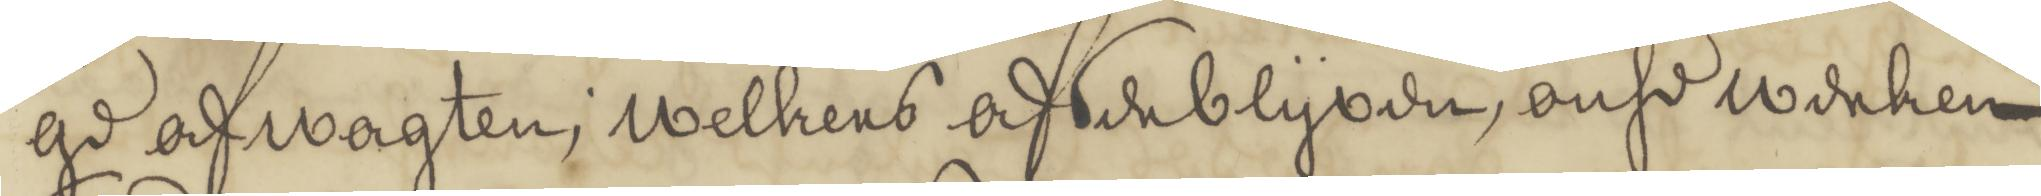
ge afwagten; welkers afterblijven, onse werken
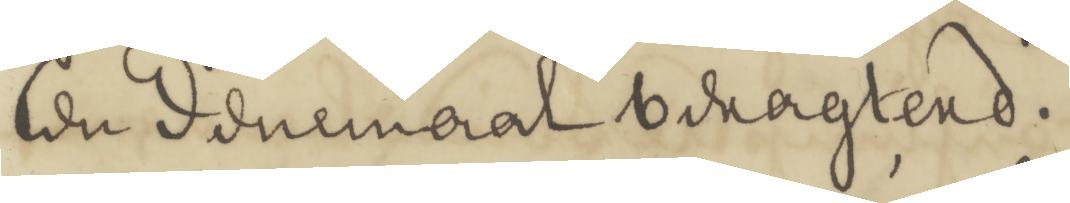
ten Eenemaal veragterd.
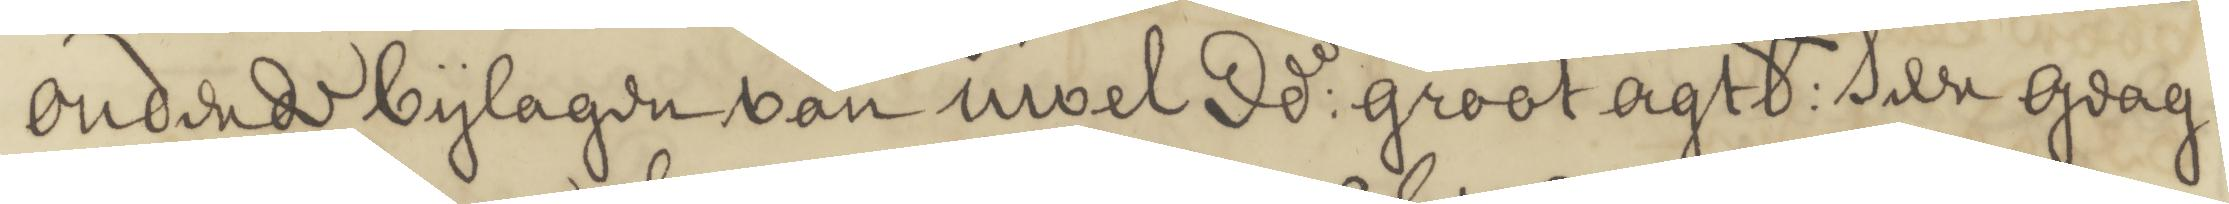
onder de bijlagen van uwel Ed:e groot agtb: seer geag.
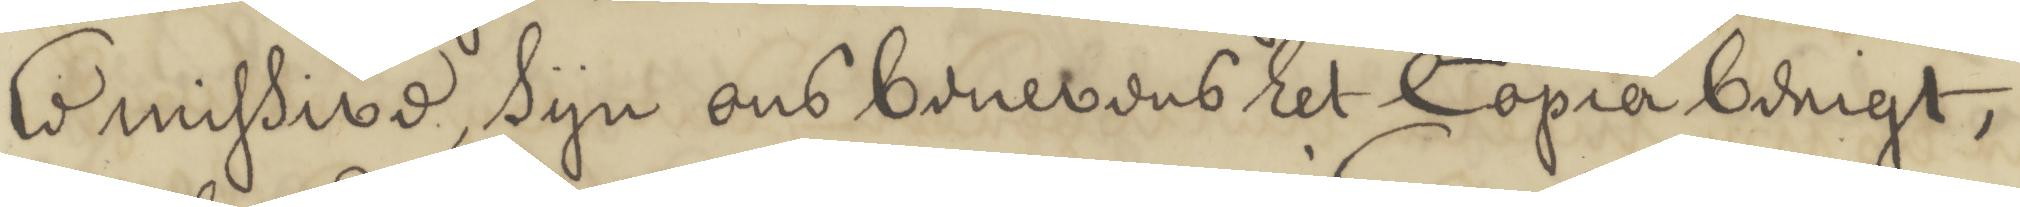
,te missive, sijn ons benevens het Copia berigt,
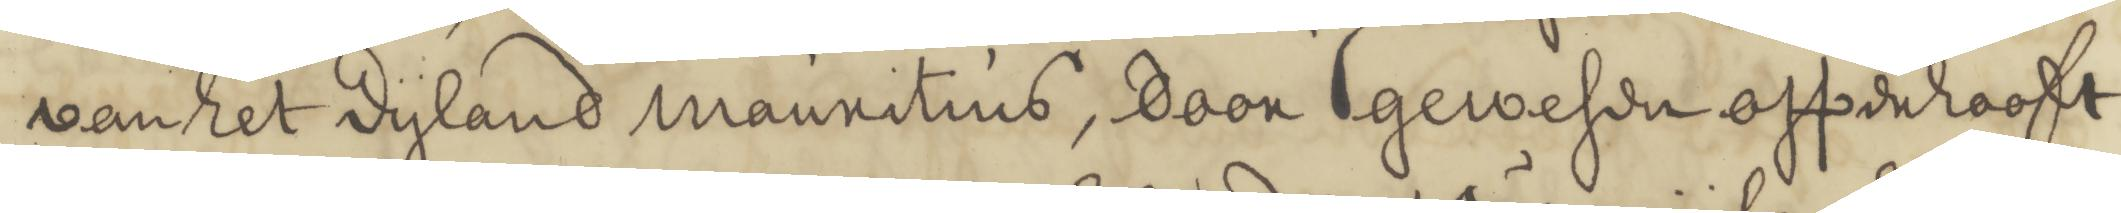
van het Eijland mauritius, door 't gewesen opperhooft
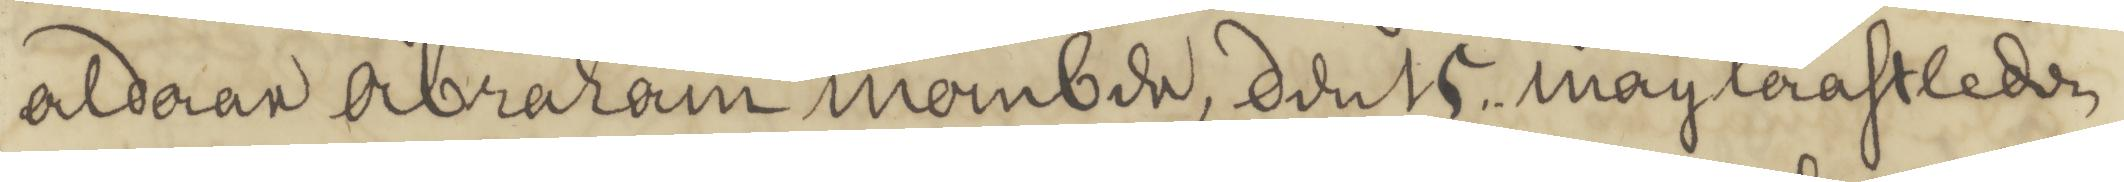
aldaar abraham momber, den 15. maij laastleden
